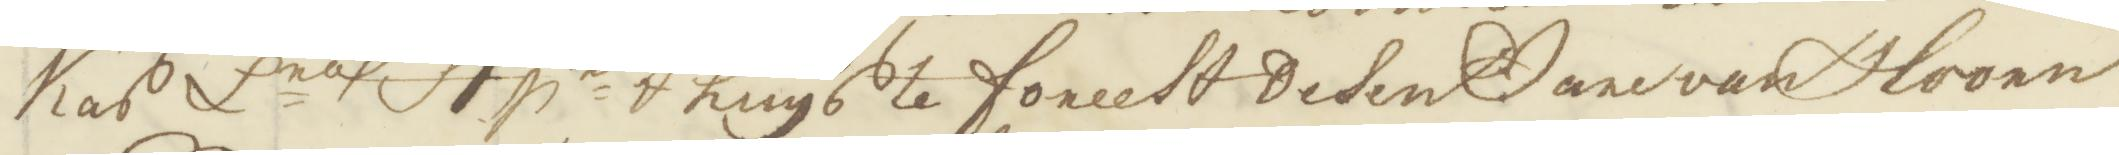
Kas L=ra st. p=r 't huijs te foreest desen Iare van Hoorn
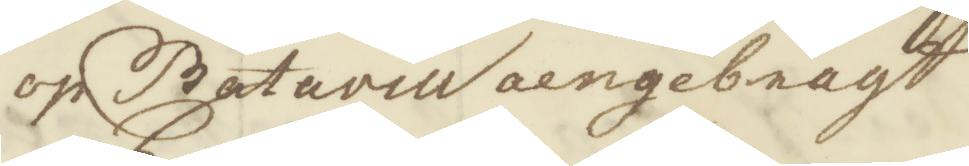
op Batavia aengebragt
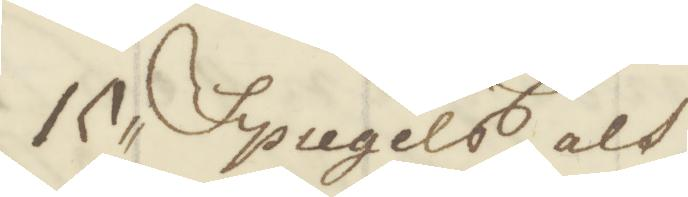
15„ Spiegels als
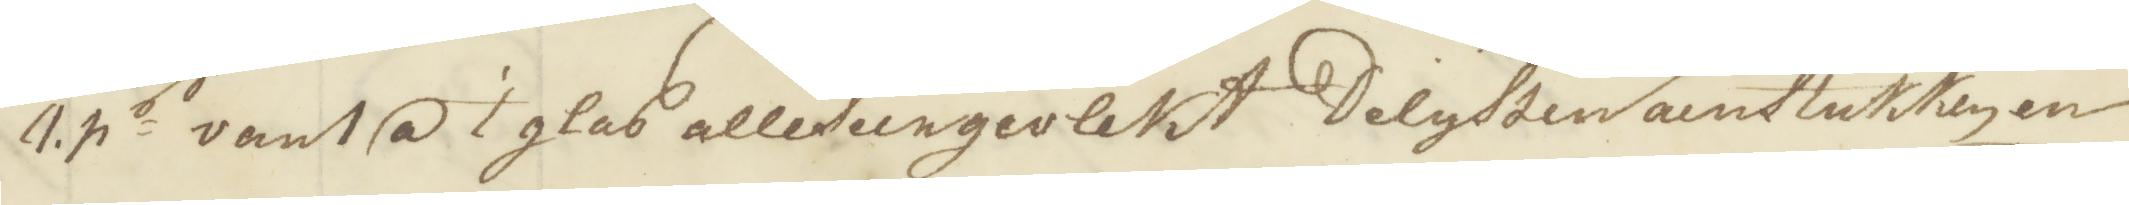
4. p=s vant @ ’t glas alles eengevlekt Delijsten aenstukken en
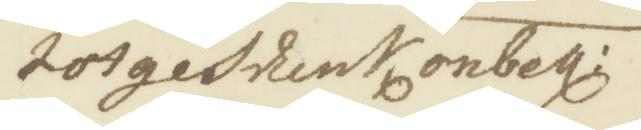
tot geschenk onbeq:
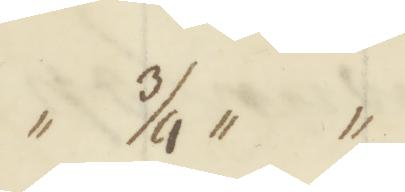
5„ „ ¾„ „
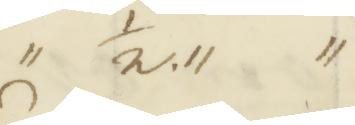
„ ½.„ „
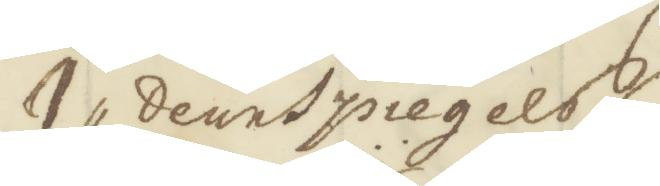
4 „ deurspiegels
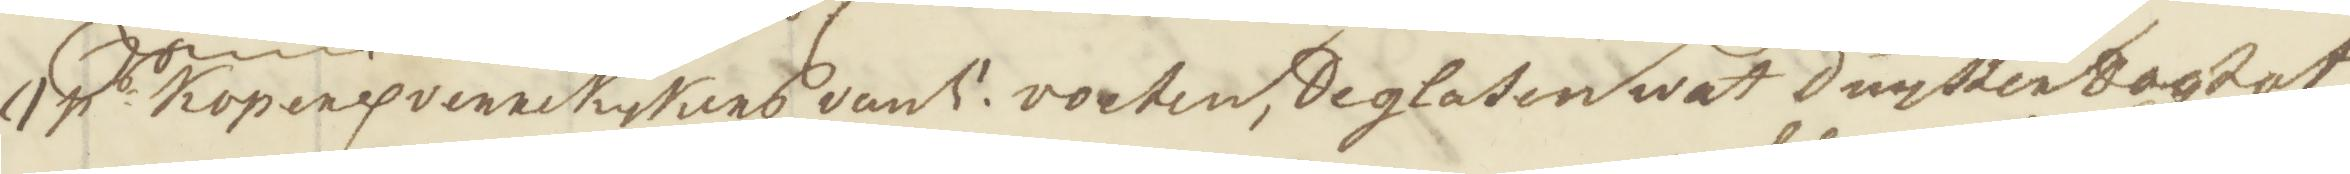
4p=s kopere verrekijkers van 5. voeten, deglasen wat duijster dog tot
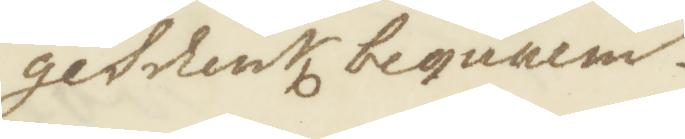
geschenk bequaem.
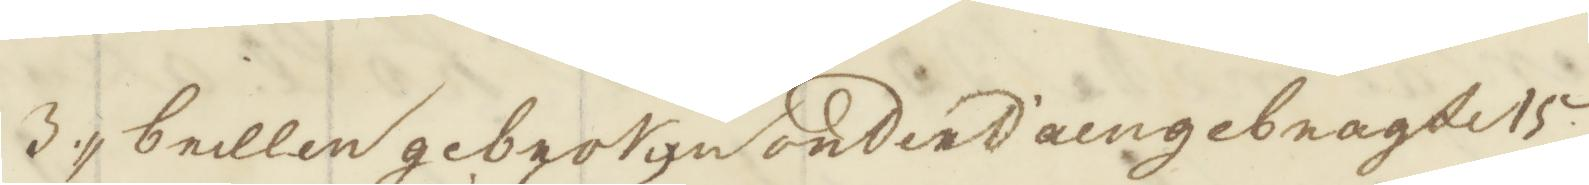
3.„ brillen gebroken onder d’aengebragde 15,
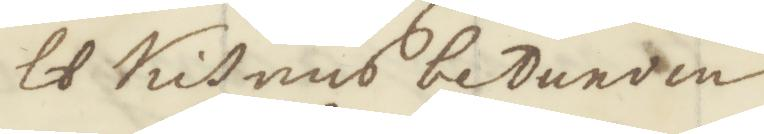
lb kisnus bedurven
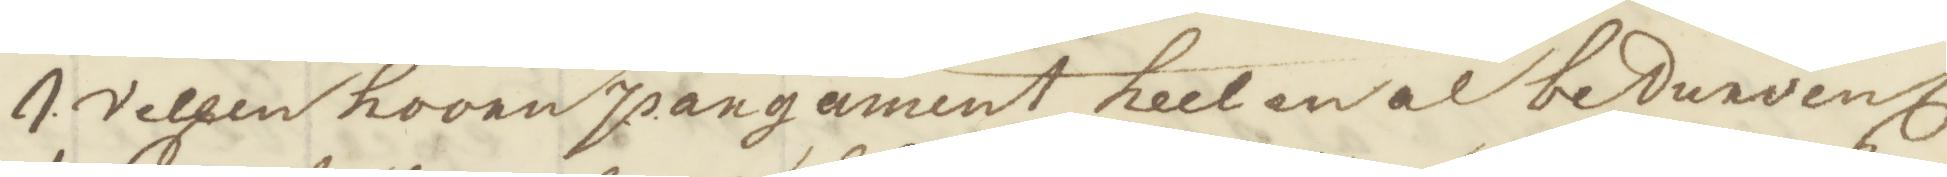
4. vellen hoorn pargament heel en al bedurven
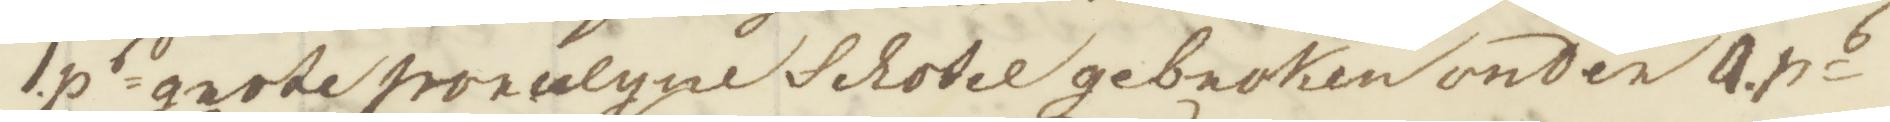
1. p=s grote porcelyne schotel gebroken onder 4. p=s
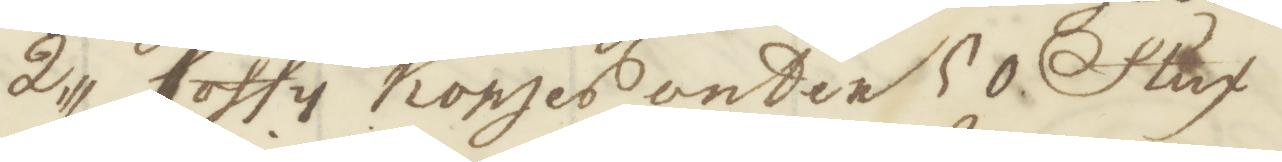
2,„ Coffij Kopjes onder 50. Stux
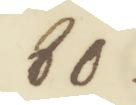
80 . „
